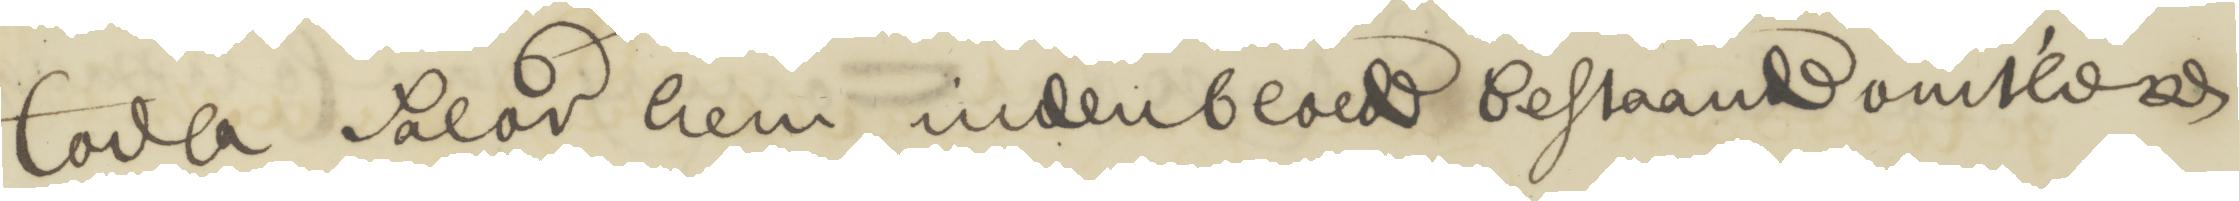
toela salor hem indenbloede bestaande omt'leven
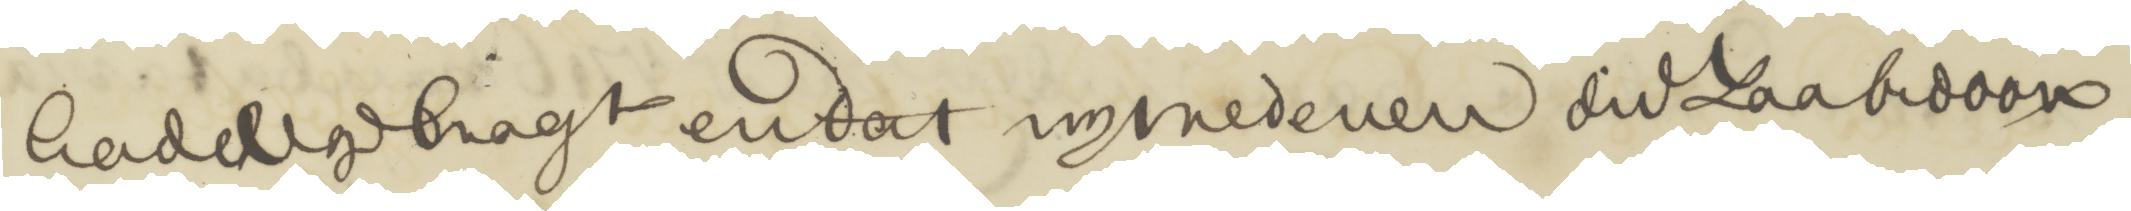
hadde gebragt endat uytredenen diezaakdoor
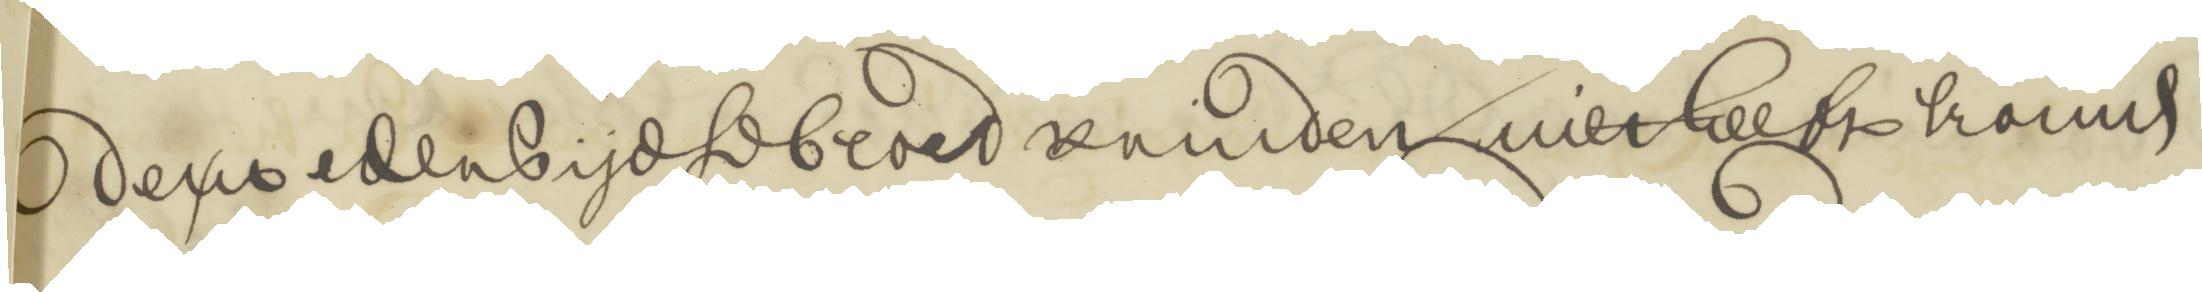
denwederbijdsebloed vrinden nietheeft konnen
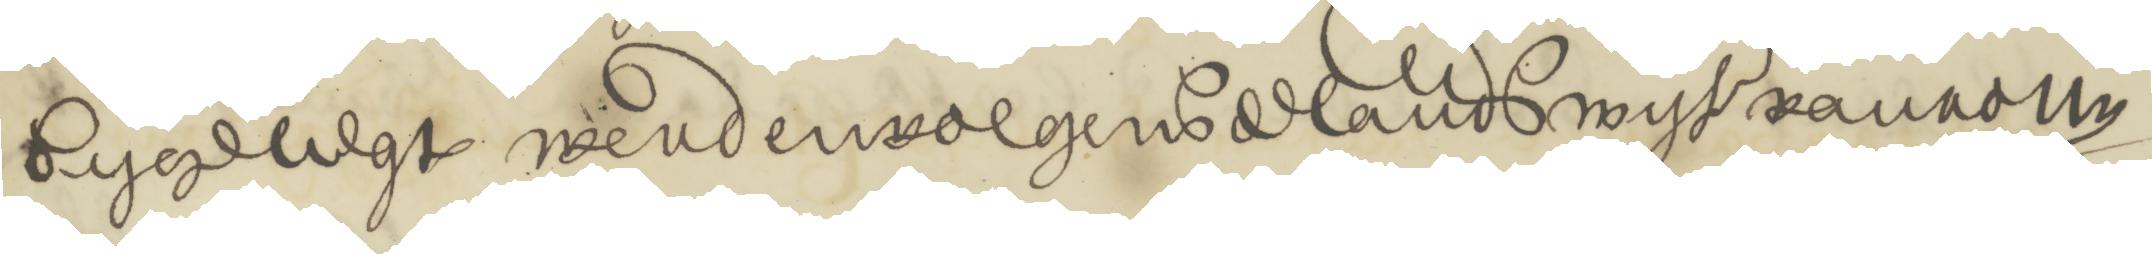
bygelegt werdenvolgens delands wyse vanrotty
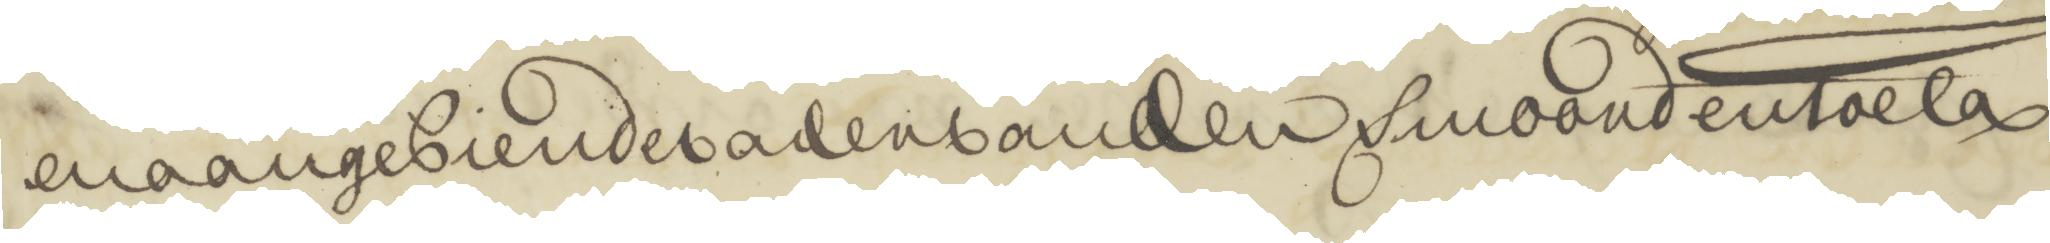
enaangesiendevadervanden vermoordentoela
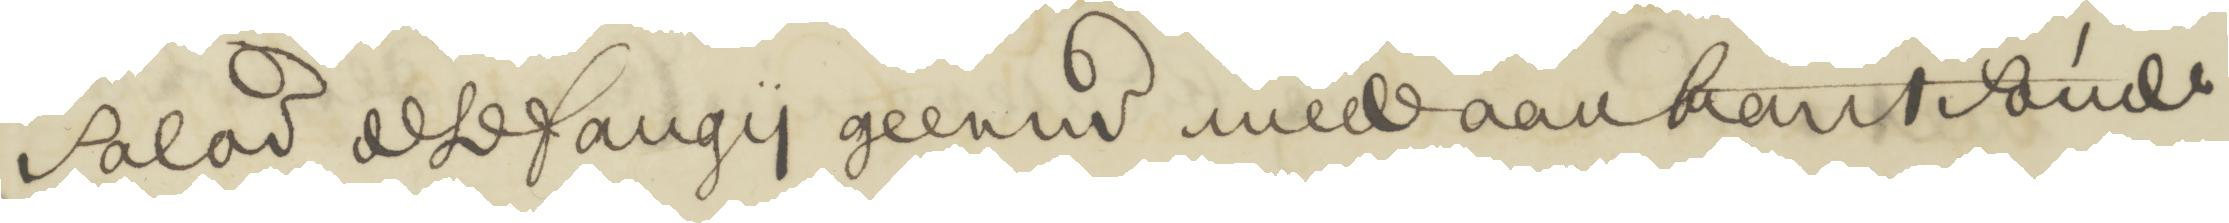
saloe desefangij geerne mede aankant soude
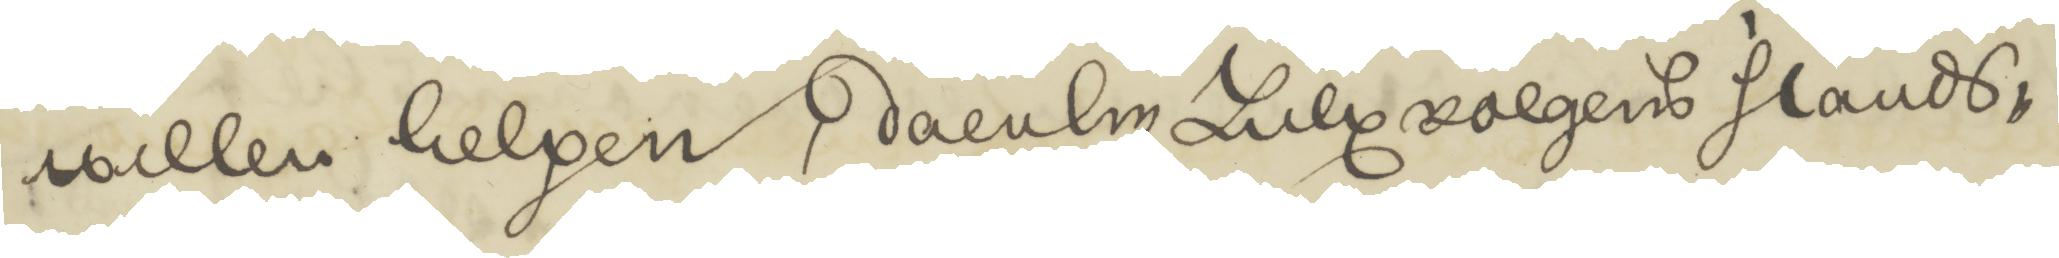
willen helpen, daerhij zulx volgens 'slands„
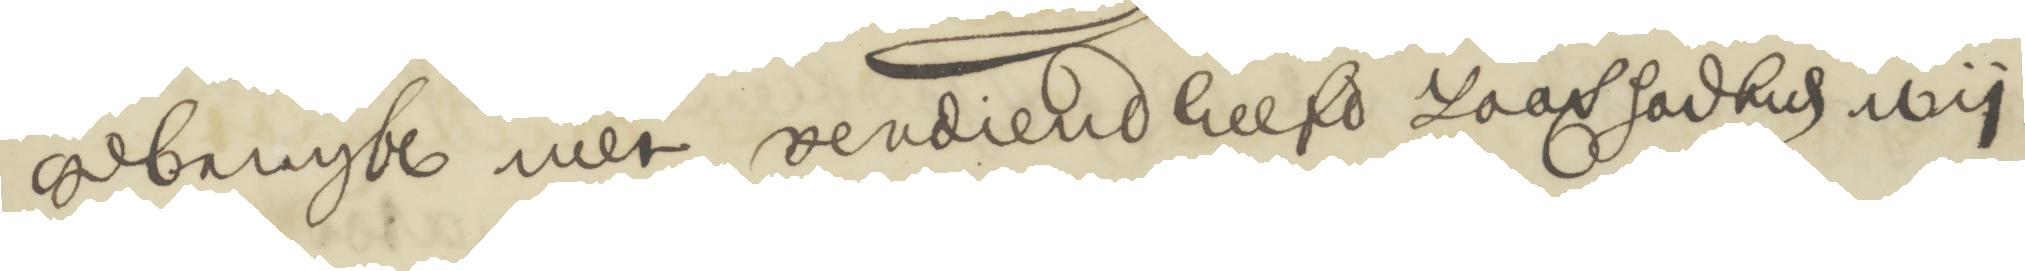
gebruyk niet verdiend heefd zooversoeken wij
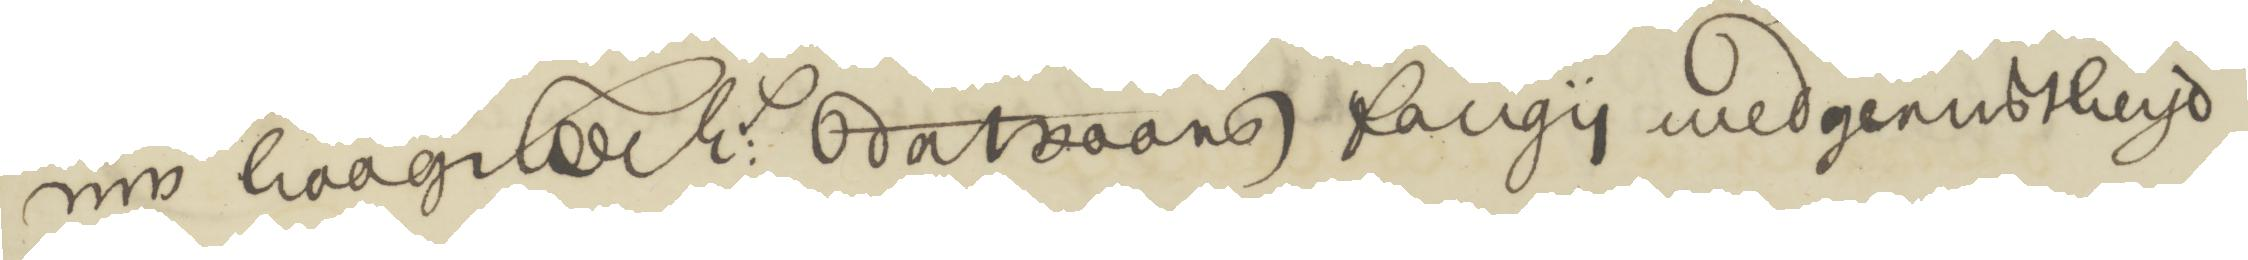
uw hoog Edelh:s datvoorsz fangij med gerustheyd
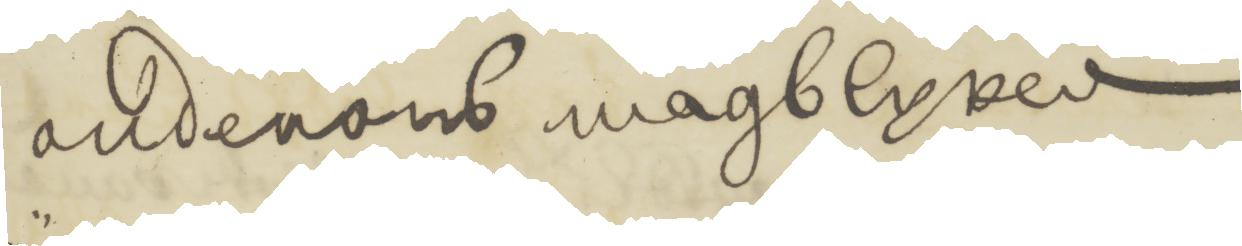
onderons magblyven
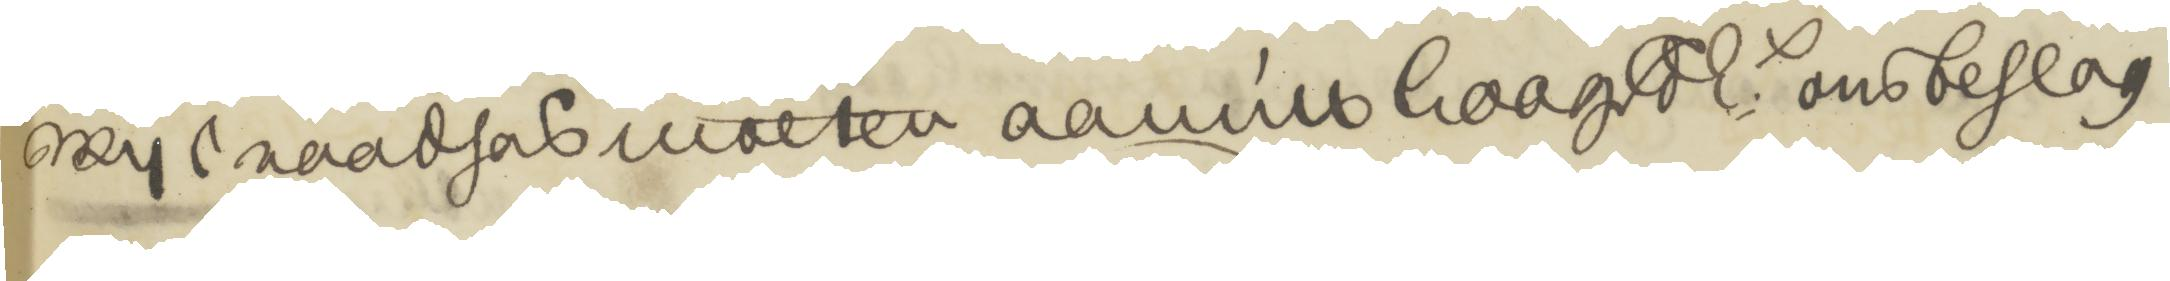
wij 5 raadjas moeten aanuw hoog Edh:s ons beslag
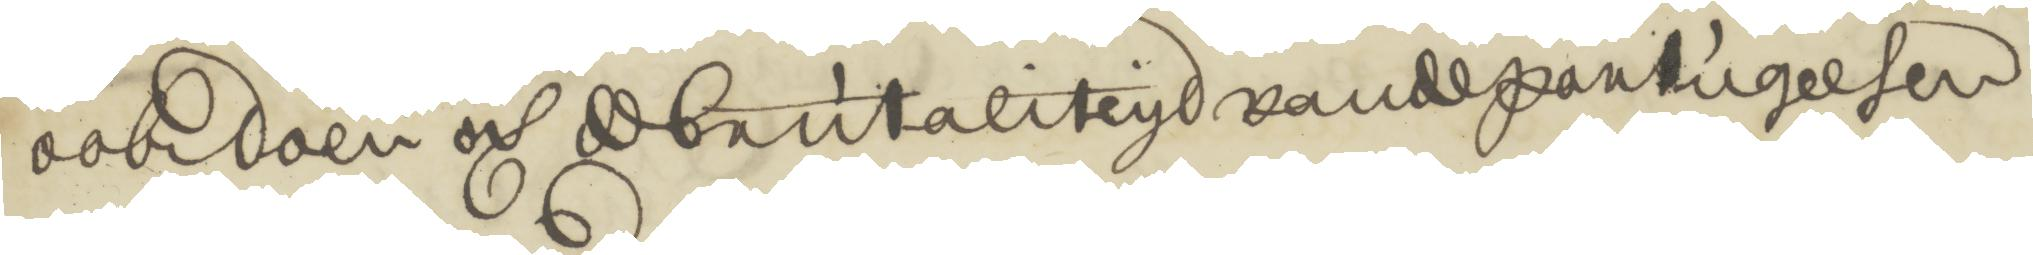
ookdoen over debrutaliteijd vandeportugeesen
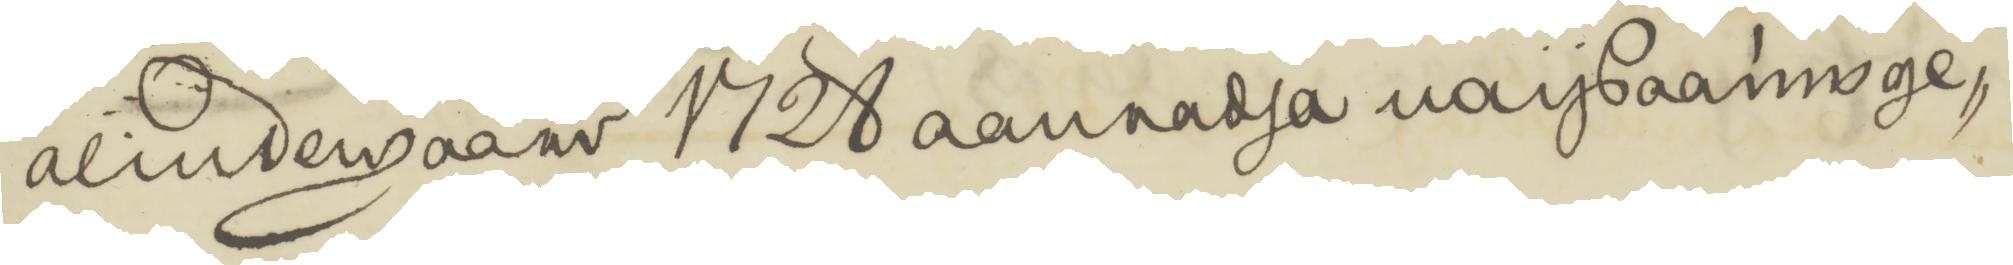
alindenjaare 1728 aanradja naijsaauw ge„
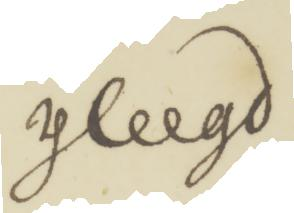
pleegd
